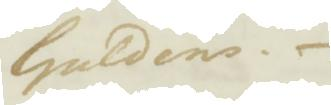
Guldens. —
